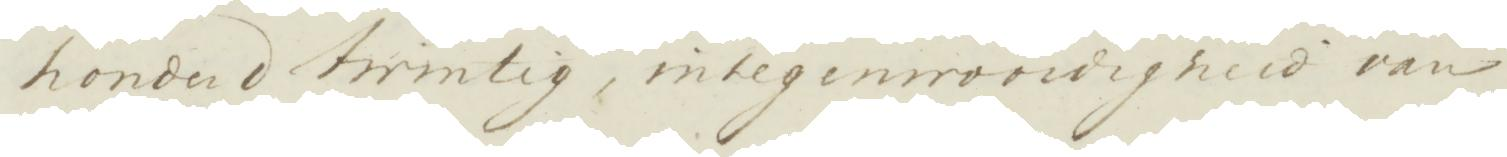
honderd twintig, integenwoordigheid van
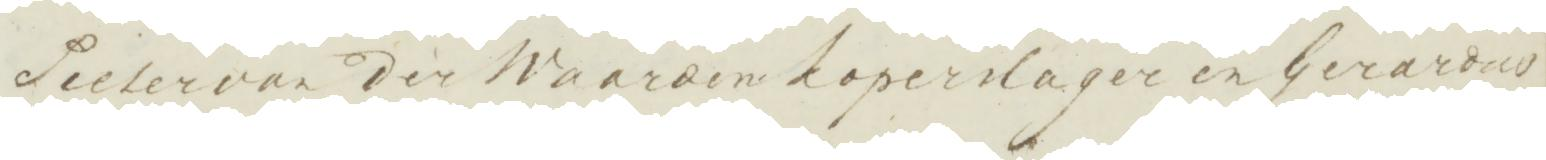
Pieter van der Waarden koperslager en Gerardus
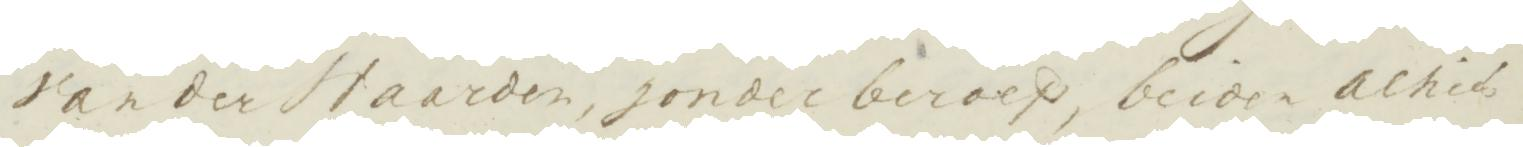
van der Waarden, zonder beroep, beiden alhier
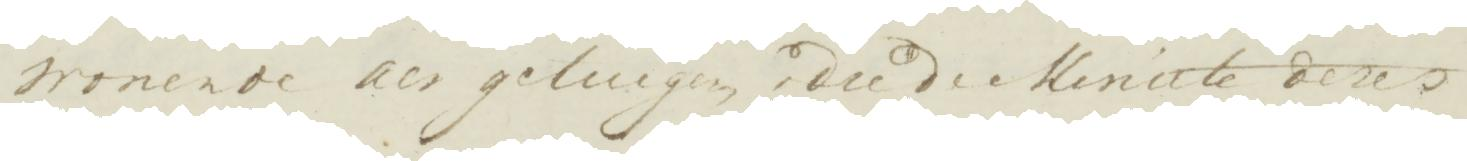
wonende als getuigen ,die de Minute dezes
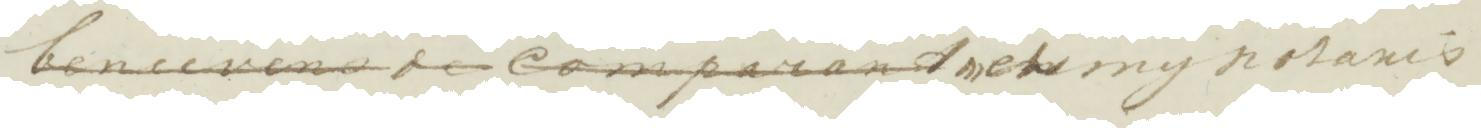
beneevens de comparant met my notaris
